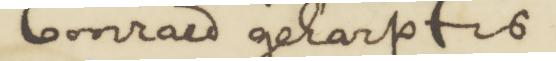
voorraed geharpt is
